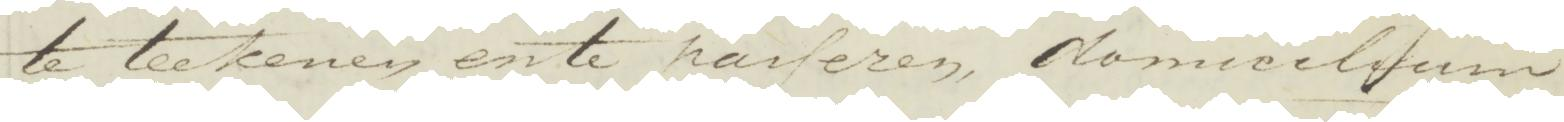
te teekenen en te passeren, domicilium
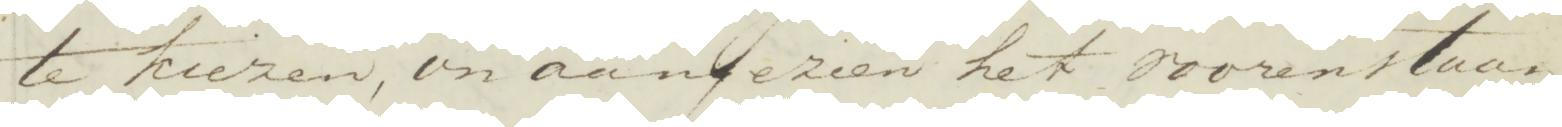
te kiezen, on aangezien het voorenstaan
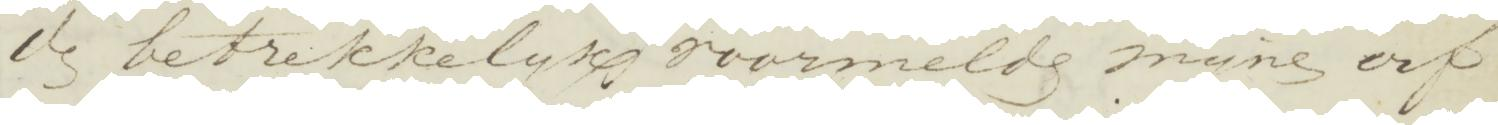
de betrekkelyk voormelde mijne erf
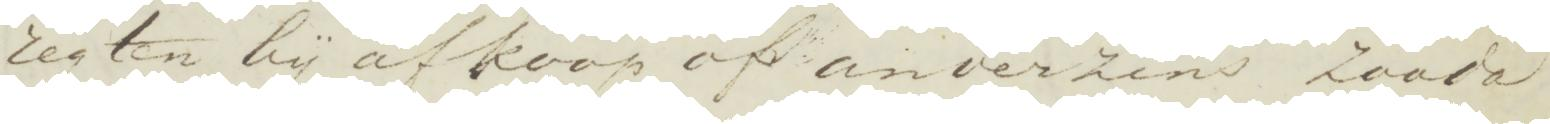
regten bij afkoop of anderzins zooda
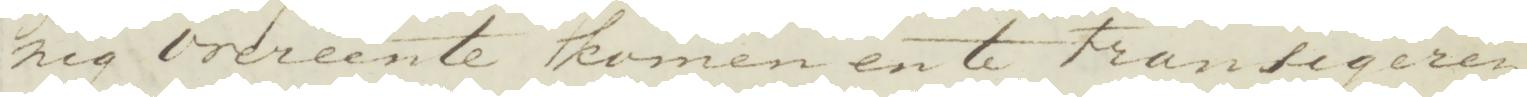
nig overeen te komen en te transigeren
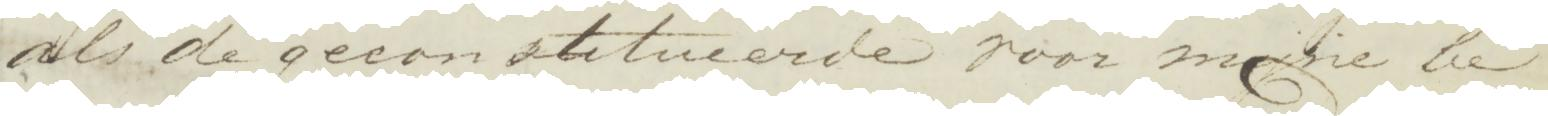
als de geconstitueerde voor mijne be
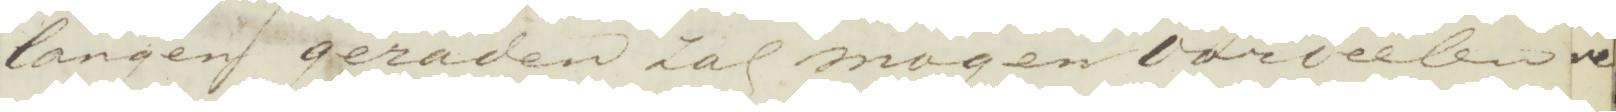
langen geraden zal mogen oordeelen
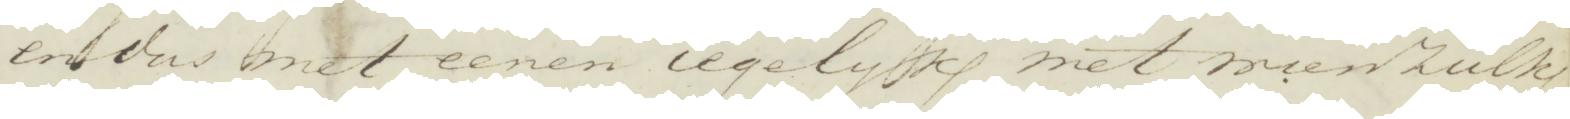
en dus met eenen iegelijk met wien zulks
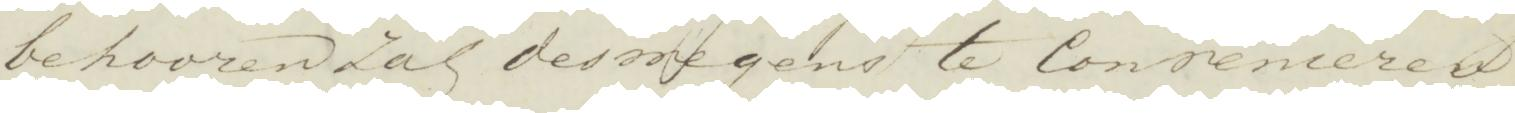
behooren zal deswegens te Convenieren
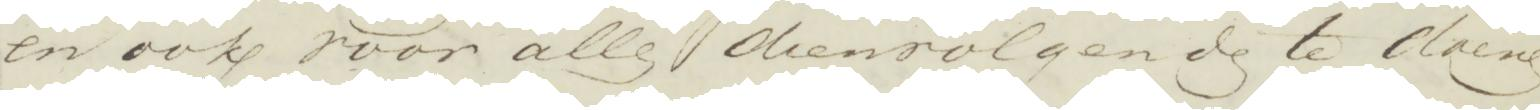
en ook voor alle dienvolgende te doen
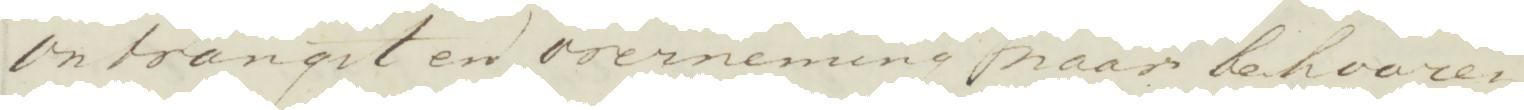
ontvangst en overneming naar behooren
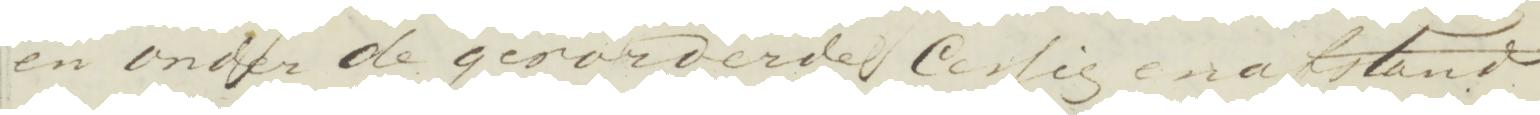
en onder de gevorderde Cessie en afstand
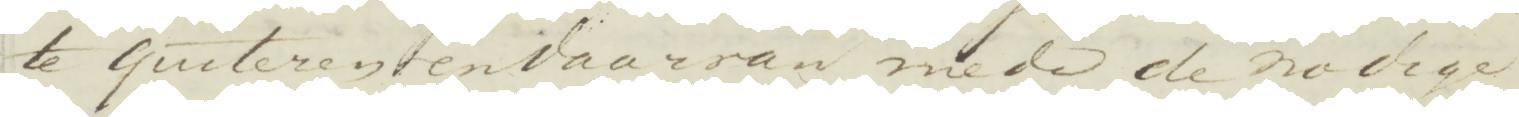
te quiteren en daarvan mede de nodige
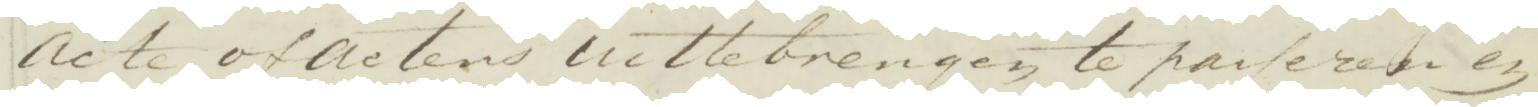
acte of actens uittebrengen te passeren en
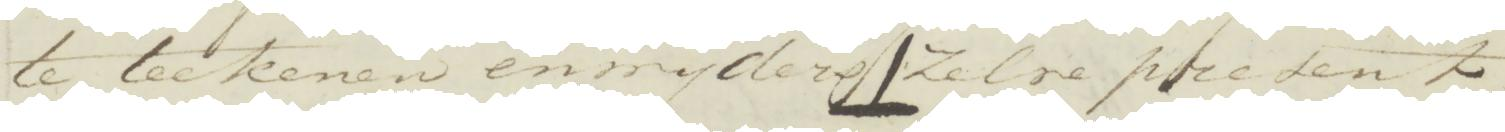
te teekenen en wijder ¶ zelve present
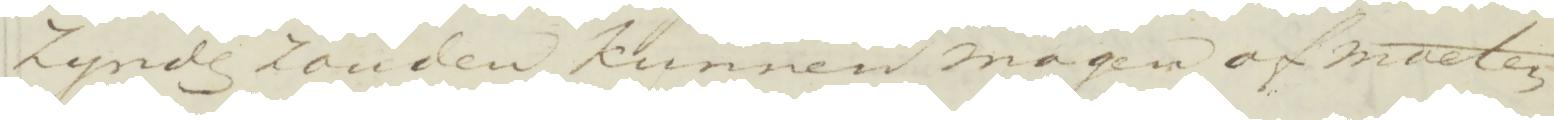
zynde zouden kunnen mogen of moeten
